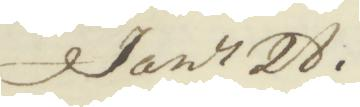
Jan 28.
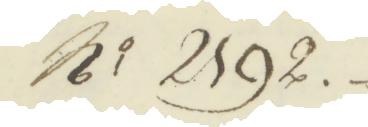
N.o 2192.
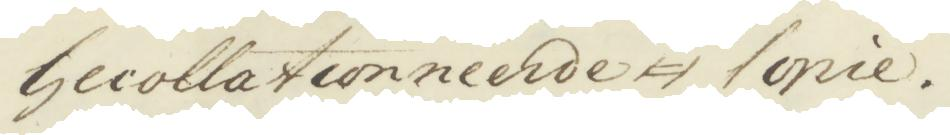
Gecollationneerde # Copie.
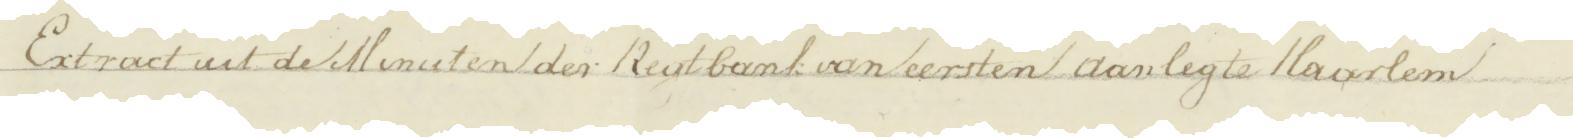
Extract uit de Minuten der Regtbank van eersten aanlegte Haarlem
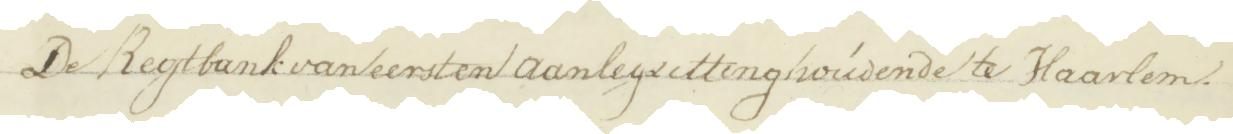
De Regtbank van eersten aanleg zitting houdende te Haarlem.
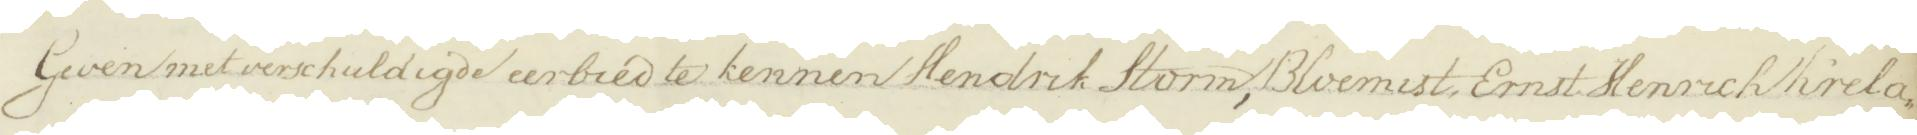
Geven met verschuldigde eerbied te kennen Hendrik Storm, Bloemist, Ernst Henrich Krela„
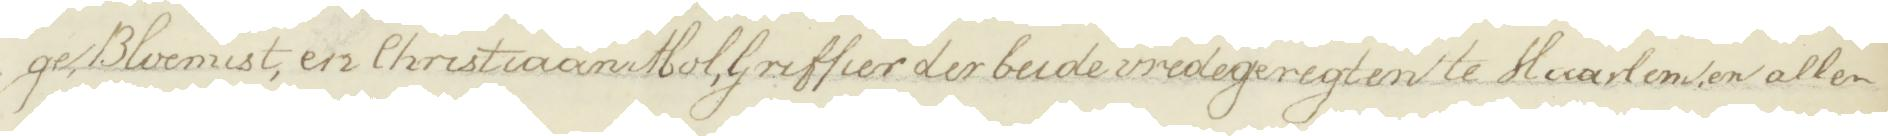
ge Bloemist, en Christiaan Mol, Griffier der beide vredegeregten te Haarlem, en allen
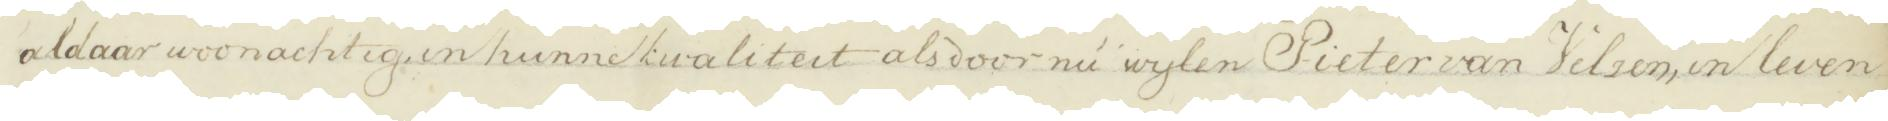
aldaar woonachtig, en hunne kwaliteit als door nu wylen Pieter van Velzen, in leven
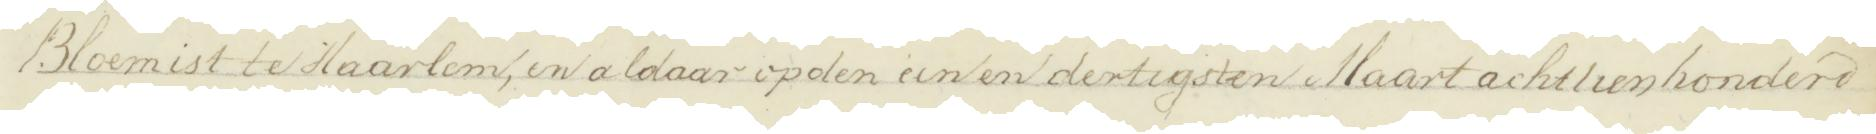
Bloemist te Haarlem, en aldaar op den een en dertigsten Maart achttien honderd
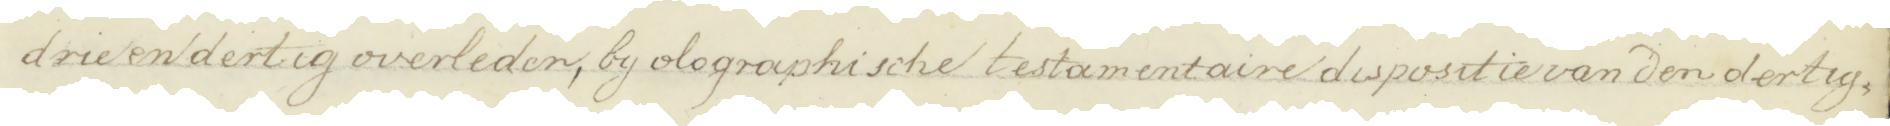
drie en dertig overleden, by olographische testamentaire dispositie van den dertig„
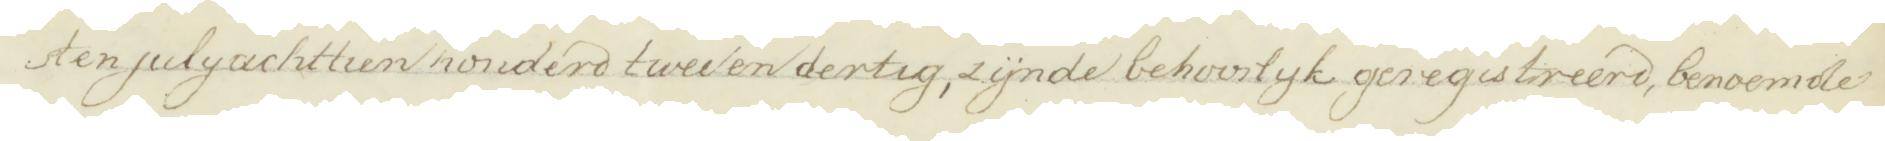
sten july achttien honderd twee en dertig, zijnde behoorlyk geregistreerd, benoemde
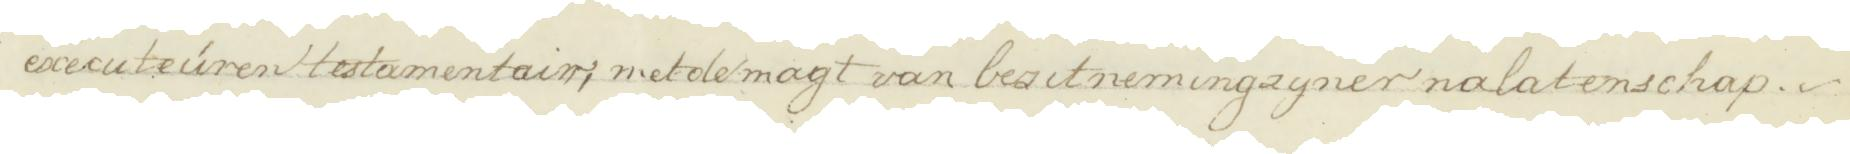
executeuren testamentair, met de magt van bezitneming zyner nalatenschap.—
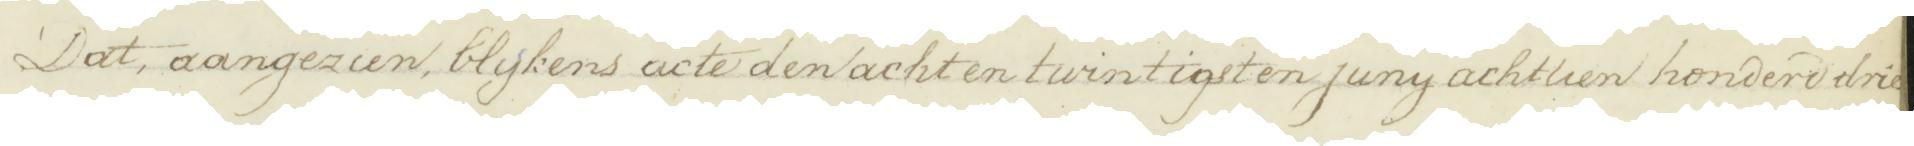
Dat, aangezien, blykens acte den acht en twintigsten Juny achttien honderd drie
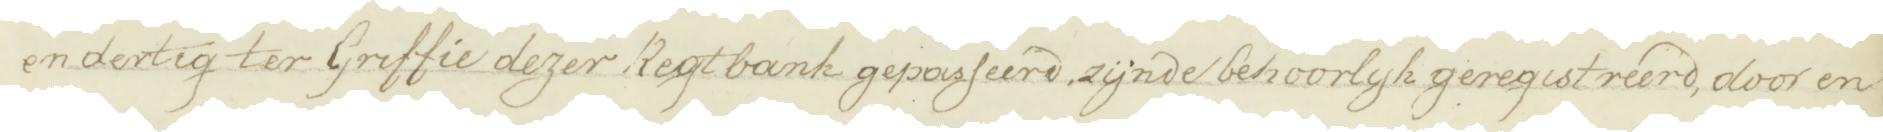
en dertig ter Griffie dezer Regtbank gepasseerd, zijnde behoorlyk geregistreerd, door en
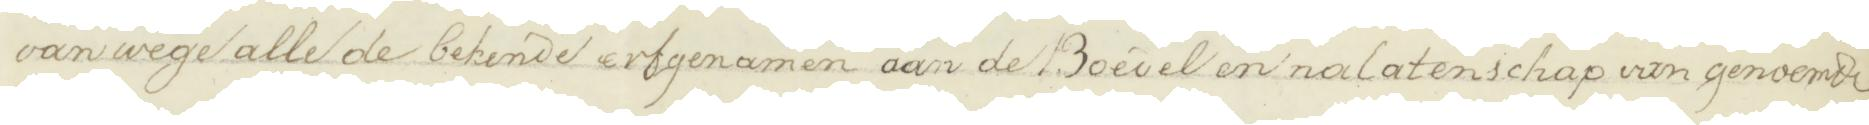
van wege alle de bekende erfgenamen aan de Boedel en nalatenschap van genoemde
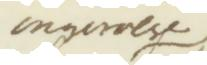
ingevolge
